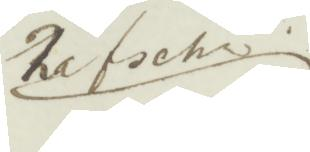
Rafschr
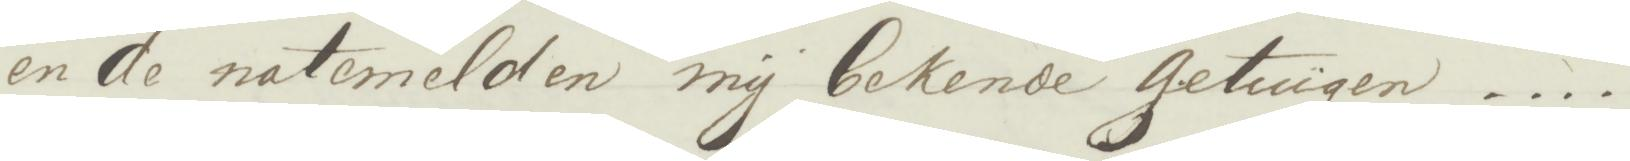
en de natemelden mij bekende getuigen . . . .
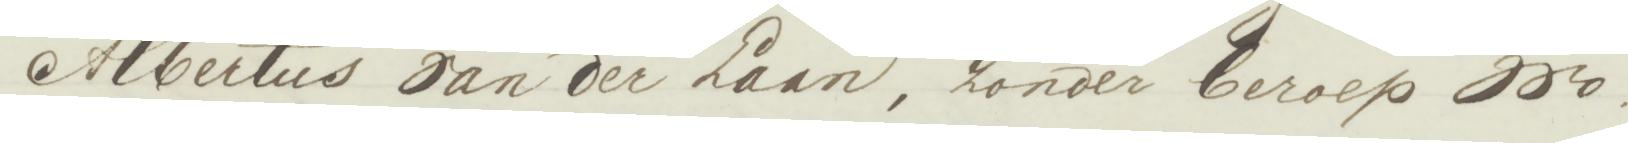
Albertus van der Laan, zonder beroep wo
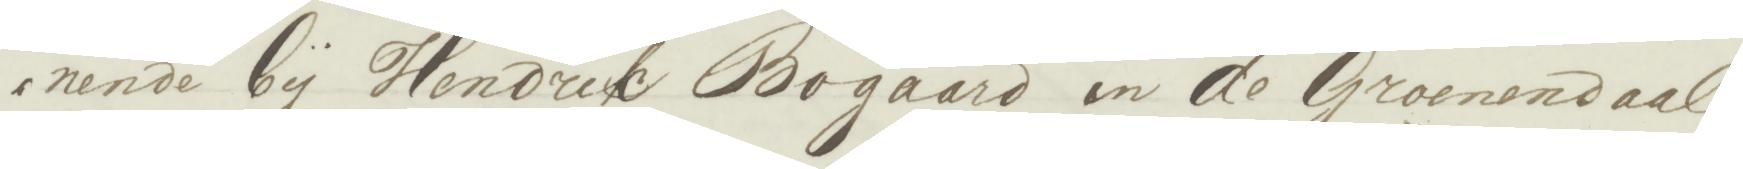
„nende bij Hendrik Bogaard in de Groenendaal
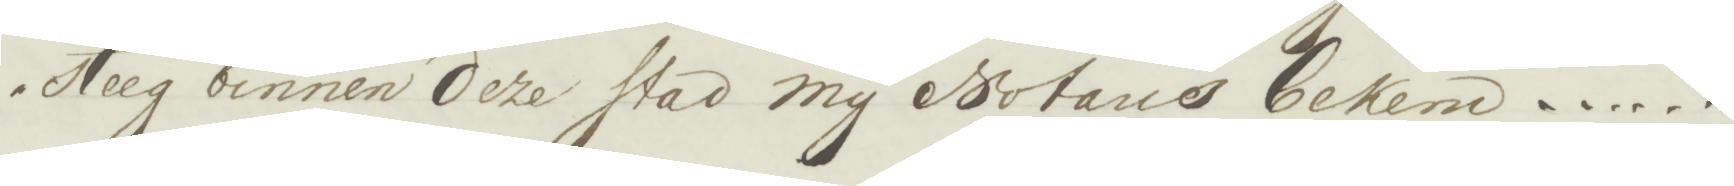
„steeg binnen deze stad mij Notaris bekend . . . . . .
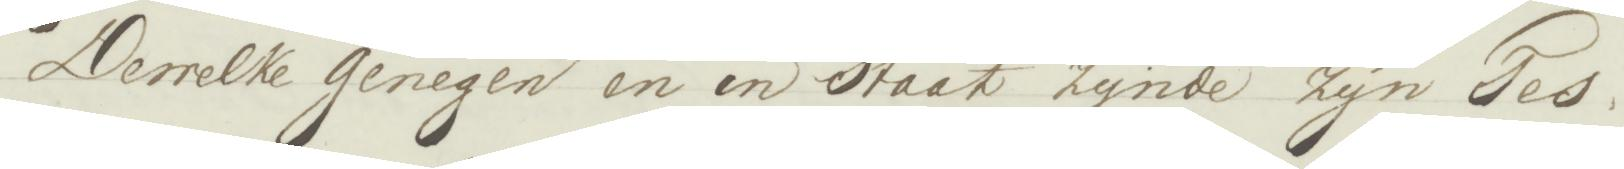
Dewelke genegen en in staat zijnde zijn Tes
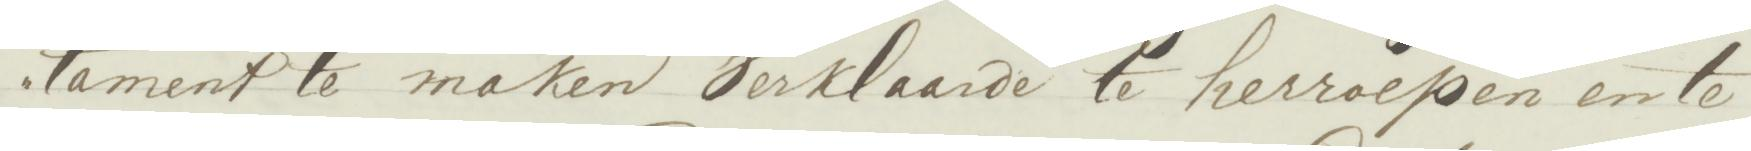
„tament te maken verklaarde te herroepen en te
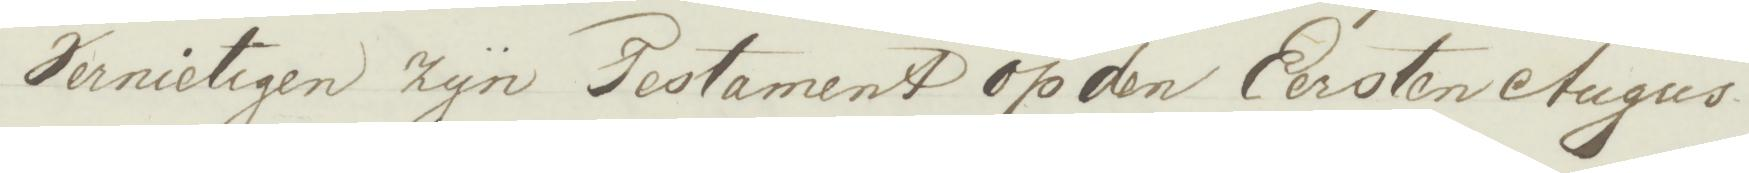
vernietigen zijn Testament op den Eersten Augus
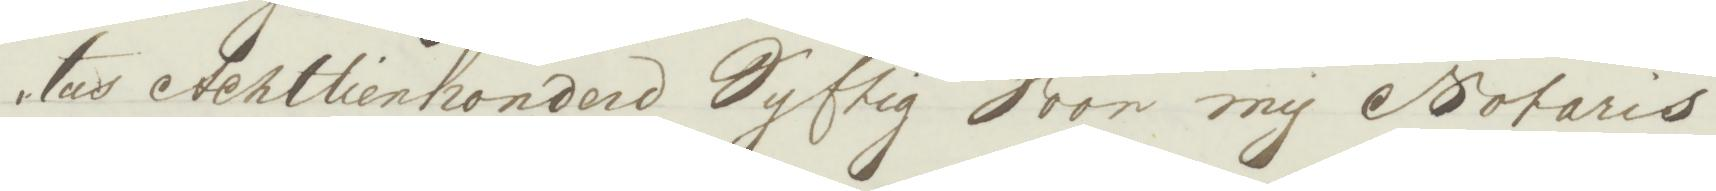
„tus Achttienhonderd Vyftig voor mij Notaris
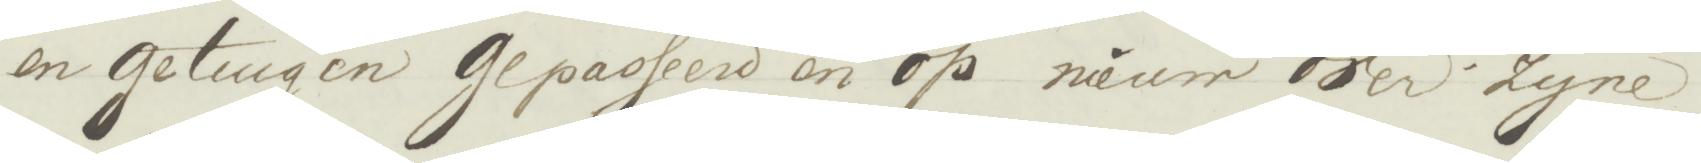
en getuigen gepasseerd en op nieuw over zyne
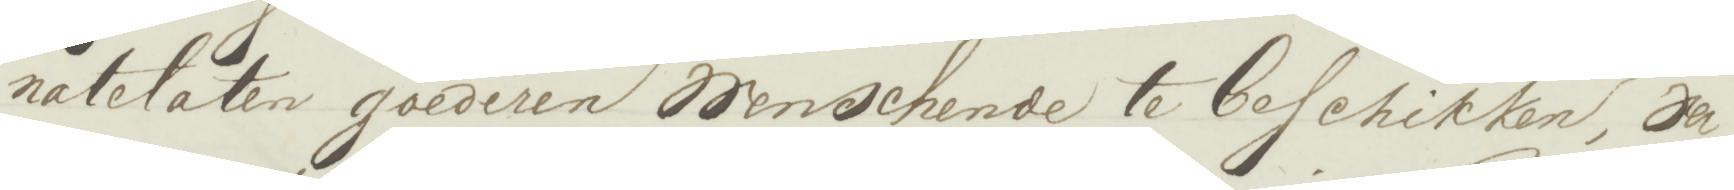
natelaten goederen wenschende te beschikken, ver
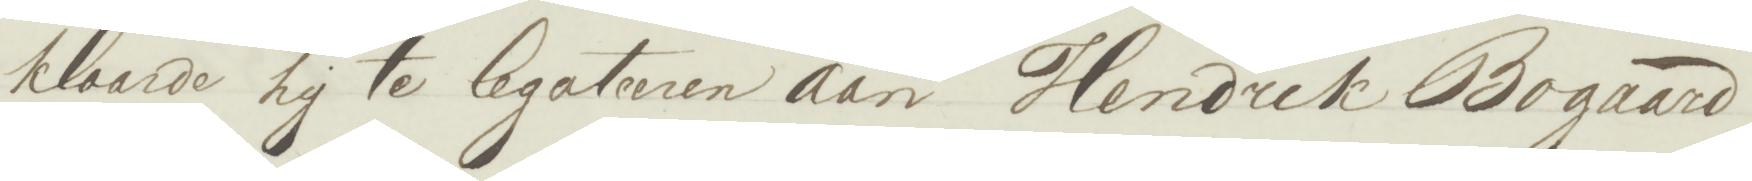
klaarde hij te legateeren aan Hendrik Bogaard
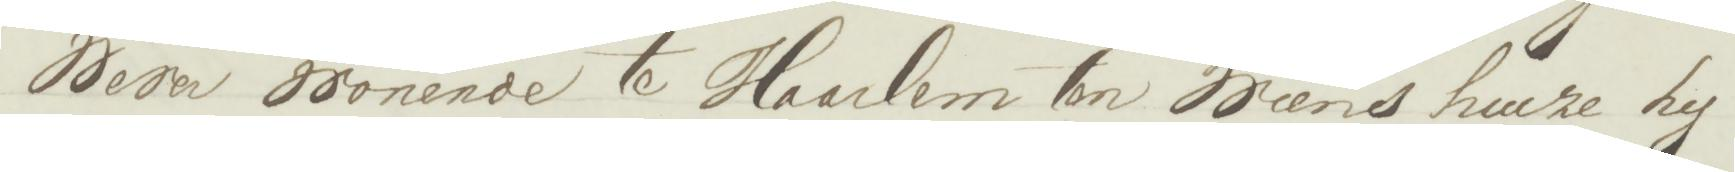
Wever wonende te Haarlem ten wiens huize hy
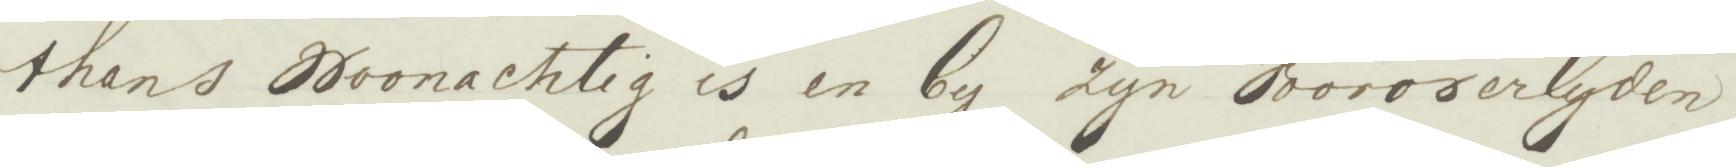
thans Woonachtig is en by zyn vooroverlyden
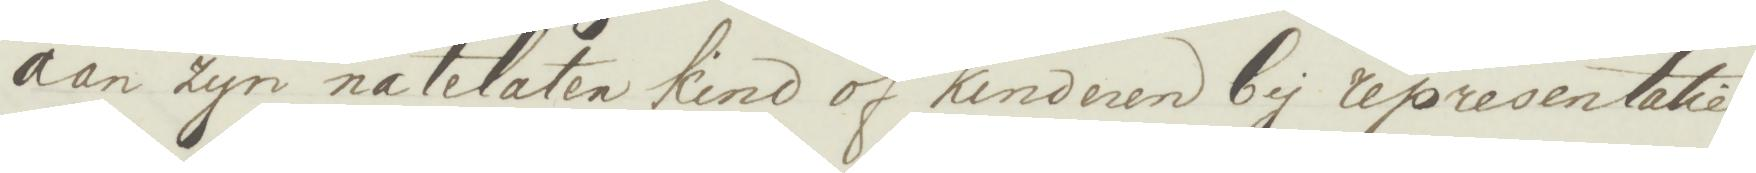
aan zijn natelaten kind of kinderen bij representatie
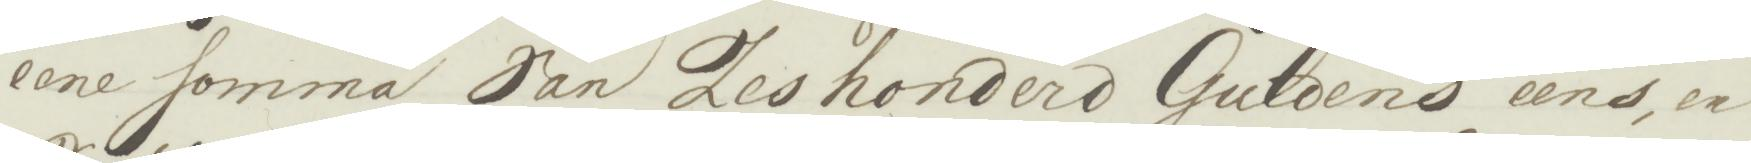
eene somma van Zeshonderd Guldens eens, en
